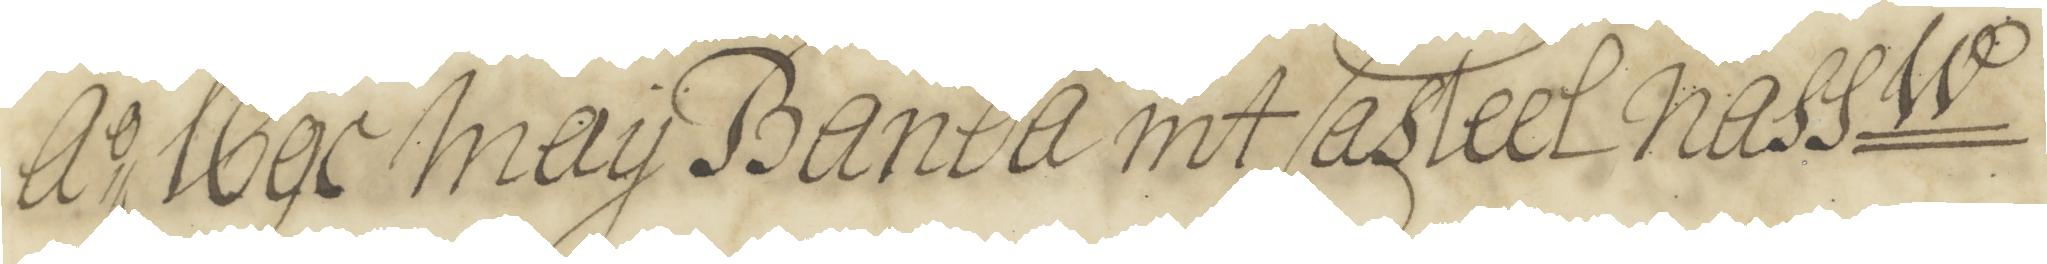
A„o 1695 Maij Banda int Casteel nass=w
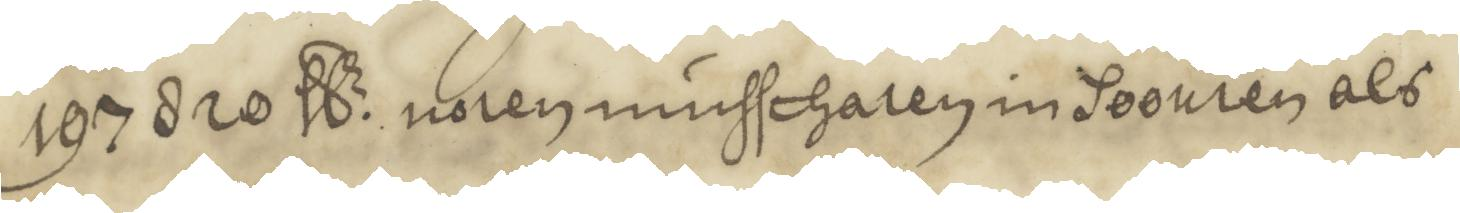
197820 lb. noten musschaten in soorten als
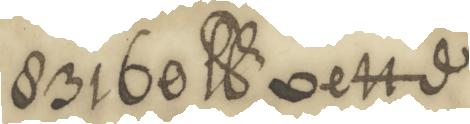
83160 lb vette
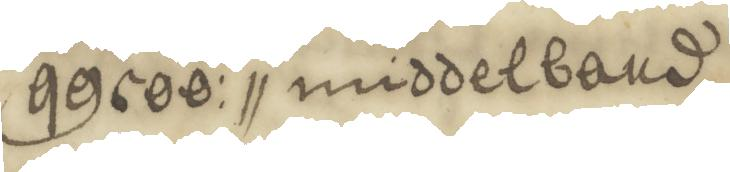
49500: „ middelbare
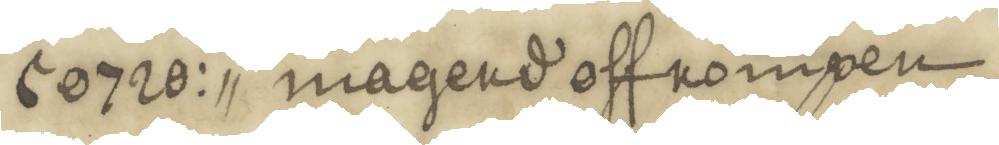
50720: „ magere off rompen
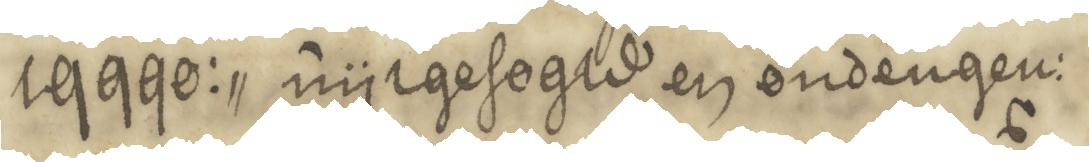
14440: „ uijtgesogte en ondeugen:
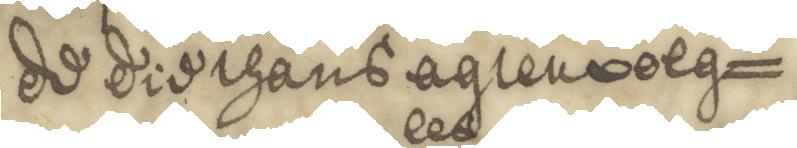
de die thans agtervolg=s
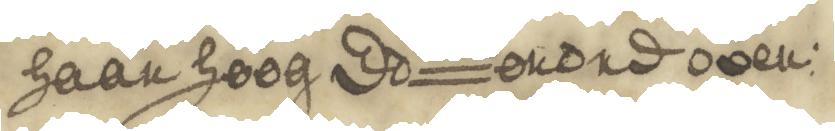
haar hoog Ed=les ordre over:
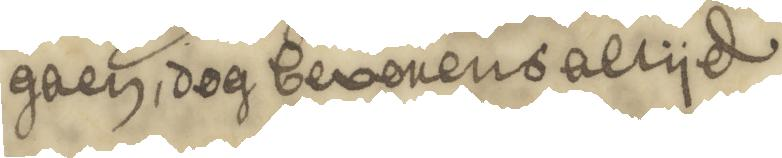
gaen, dog bevorens altijd
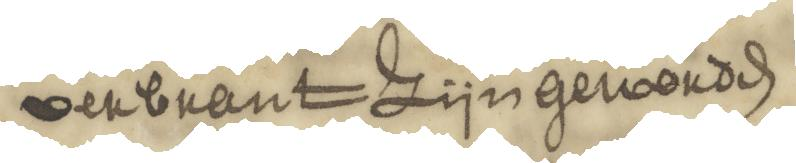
verbrant zijn geworden
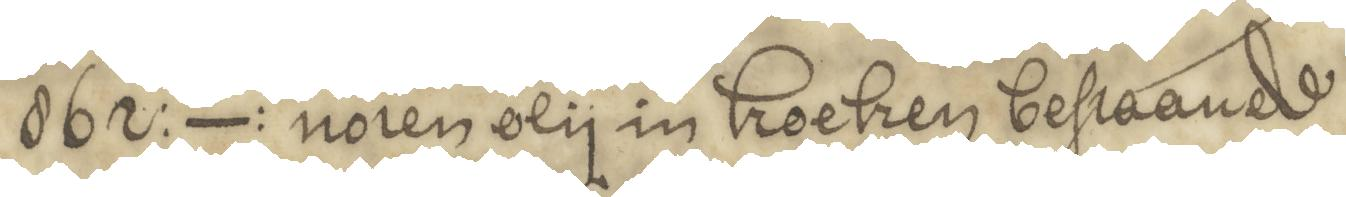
862: —: noten olij in koeken bestaande
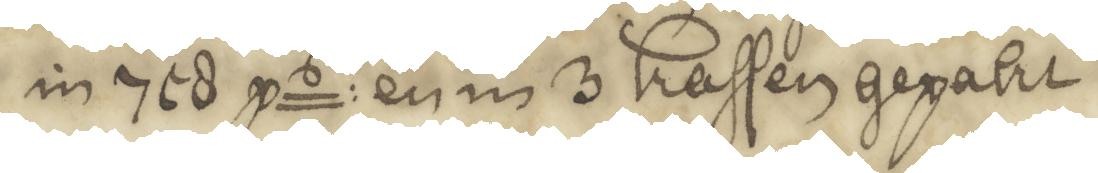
in 758 p=s: en in 3 kassen gepakt
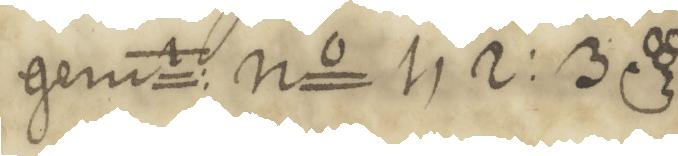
gem=t: n=o 112: 3 o
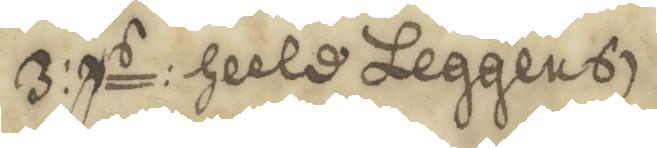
3: p=s: heele Leggers
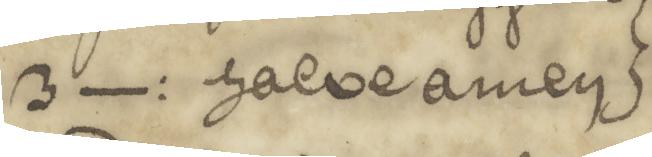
3 —: halve amey
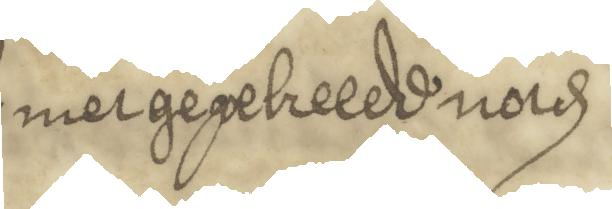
met gepekelde noten
